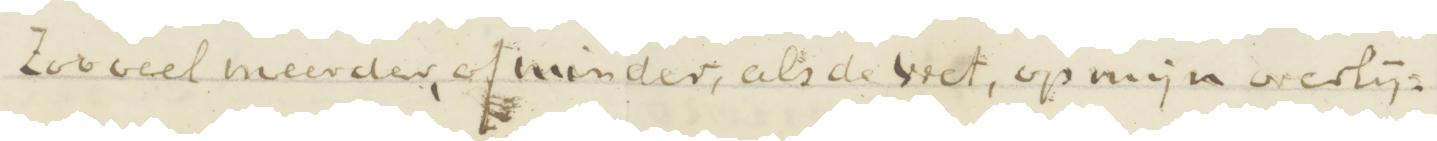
zoo veel meerder of minder, als de wet, op mijn overlij:
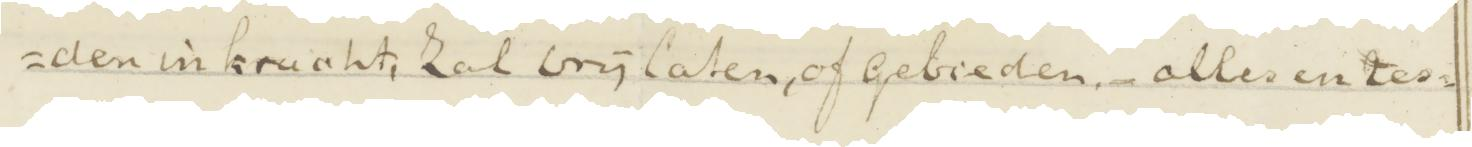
=den in kracht, zal vrijlaten, of gebieden, - alles en res„
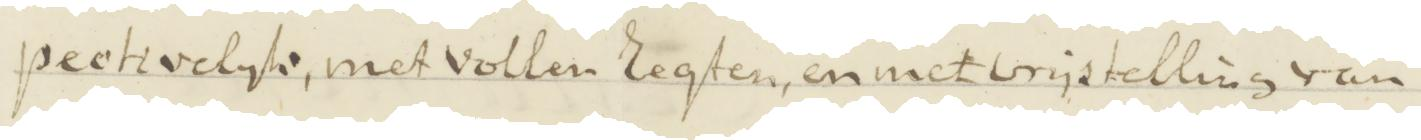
pectivelyk, met vollen regten, en met vrijstelling van
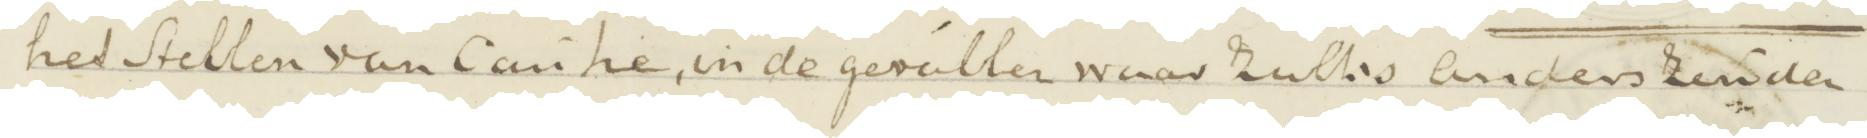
het stellen van Cautie, in de gevallen waar zulks anders zouden
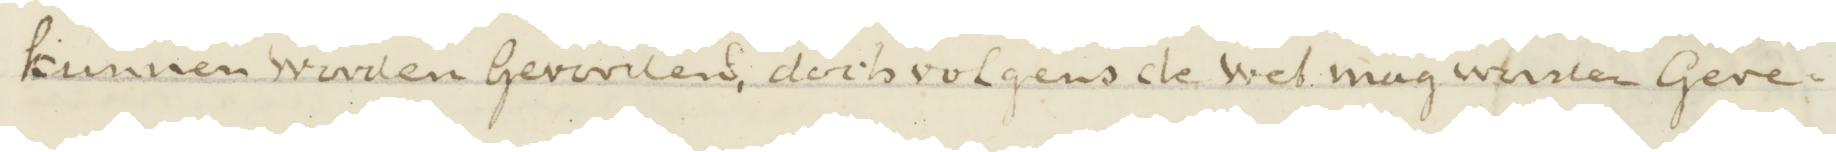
kunnen worden Gevorderd, doch volgens de wet mag worden Gere„
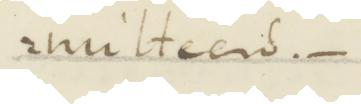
=mitteerd.—
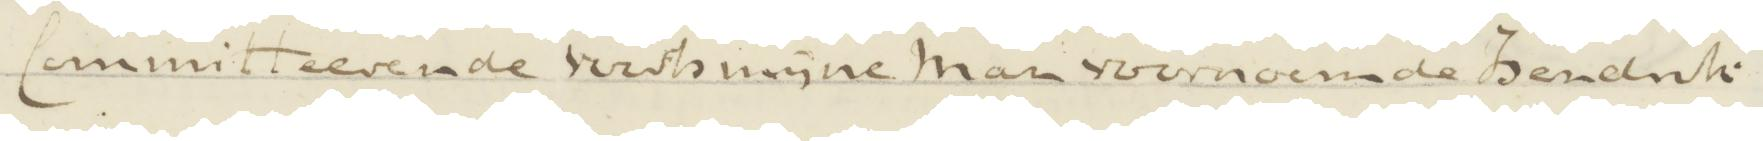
Committeerende voorts mijne Man voornoemde Hendrik
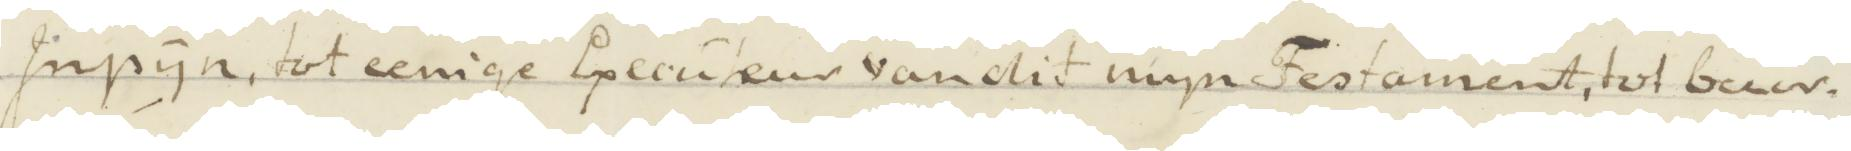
Jupijn, tot eenige Executeur van die myn Testament, tot bezor„
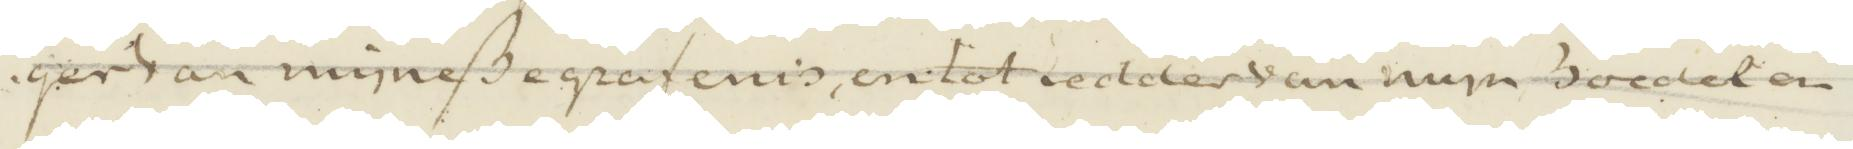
„ger van mijne Begrafenis, en tot redder van myn Boedel en
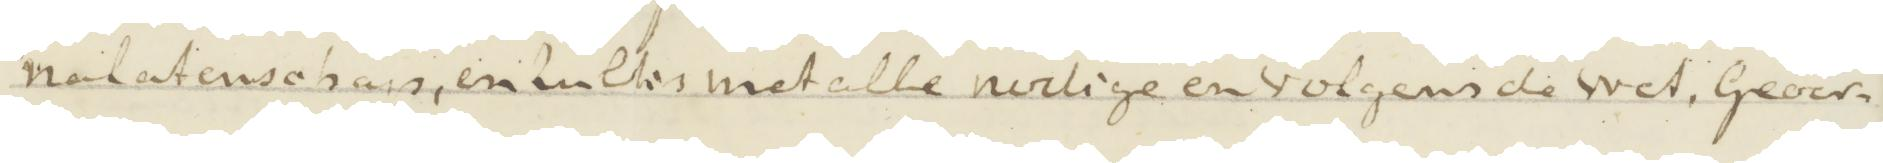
nalatenschap, en zulks met alle nodige en volgens de wet, geoor
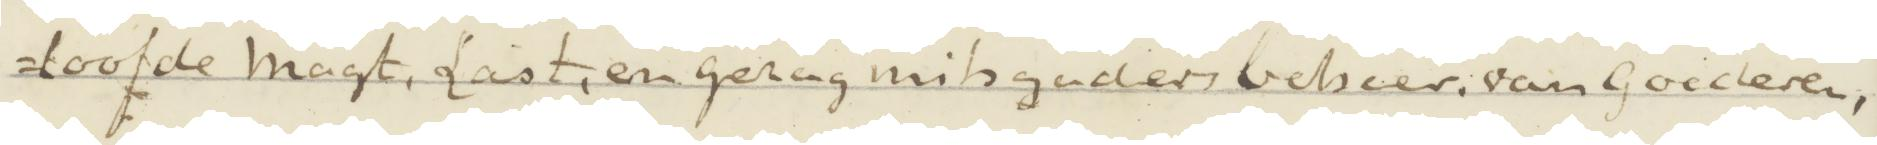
=loofde magt, Last, en gezag mitsgaders beheer van goederen,
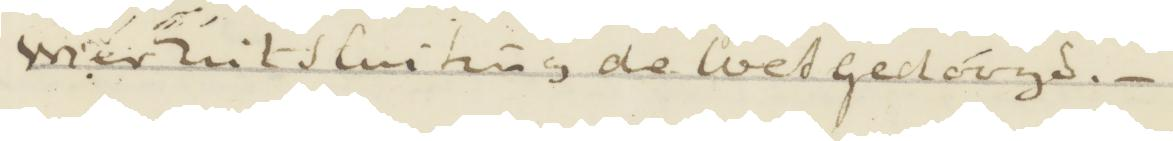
wier uitsluiting de wet gedoogd. —
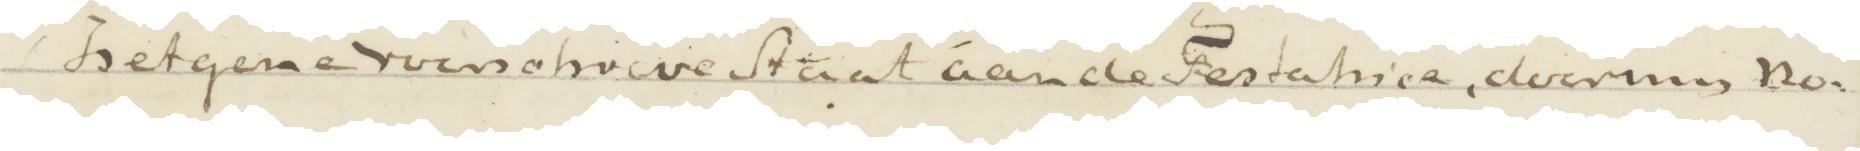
Hetgene voorscheve staat aan de Testatrice, doormy No:
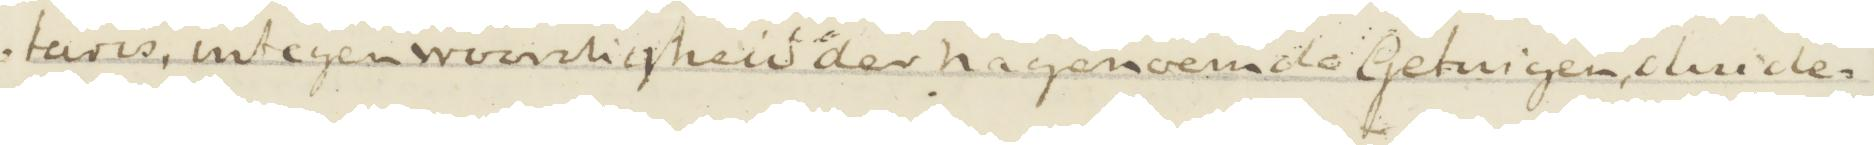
.taris integenwoordigheid der nagenoemde Getuigen, duide=
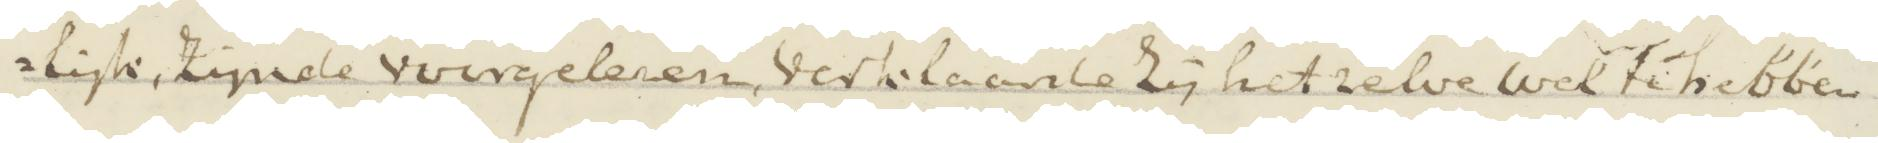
=lijk, Zijnde voorgelezen, Verklaarde Zij het zelve wel te hebben
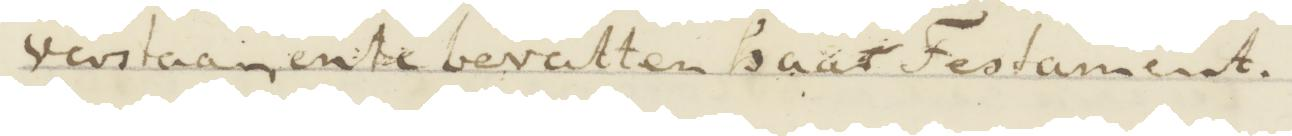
verstaan en te bevatten haar Testament.
